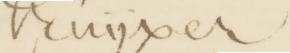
kuijper
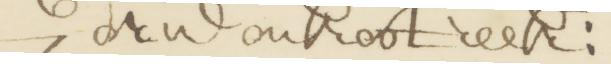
drie onkost reek:
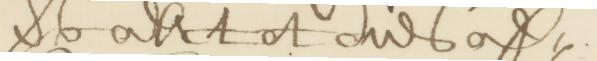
versoek tot dies af„
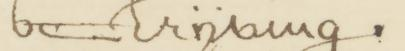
schrijving.
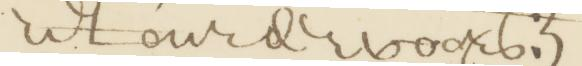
retour der voorsz:
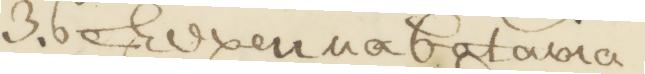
3. schepen na batavia
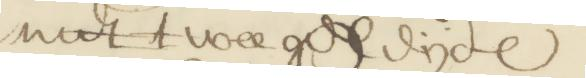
met twee geleijde
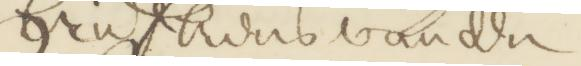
briefkens van den
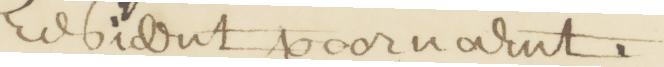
resident voornoemt.
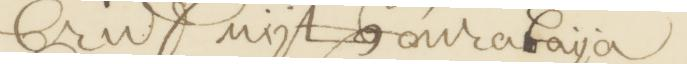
brief uijt sourabaija
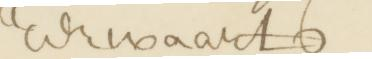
herwaarts
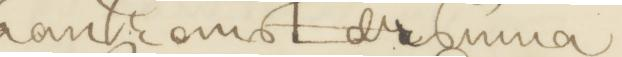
aankomst der suma
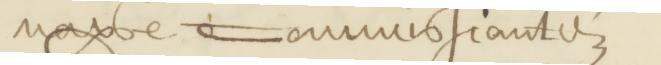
napse commissianten
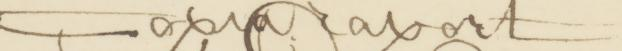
copia raport
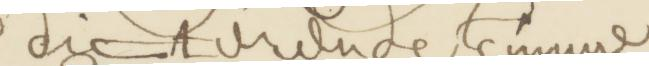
dicterende hunne
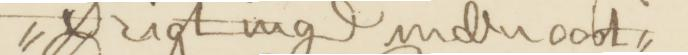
„verrigtinge in den oost„
